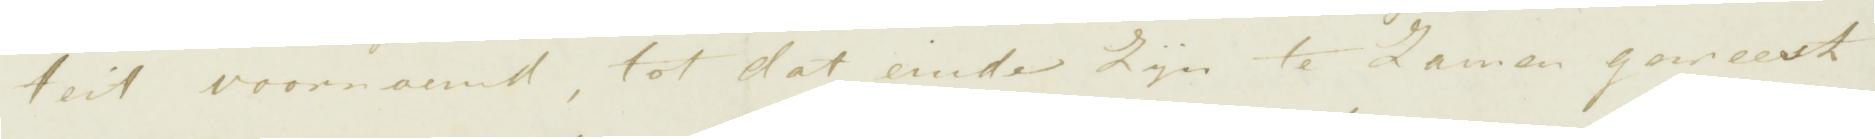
teit voornoemd, tot dat einde zijn te zamen geweest
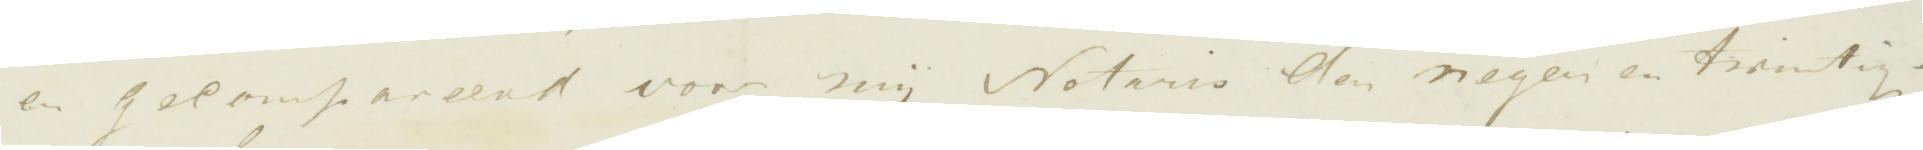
en gecompareerd voor mij Notaris den negen en twintig.
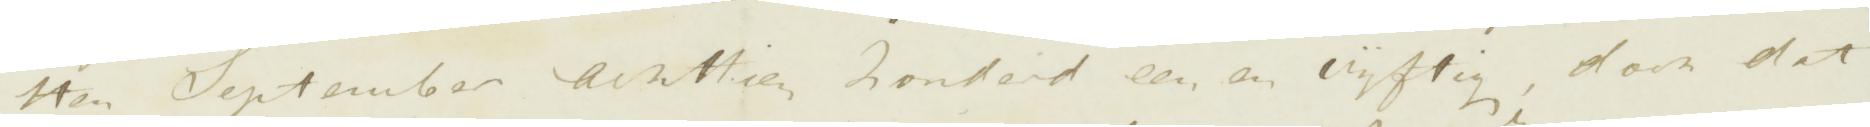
sten September achttien honderd een en vijftig, door dat
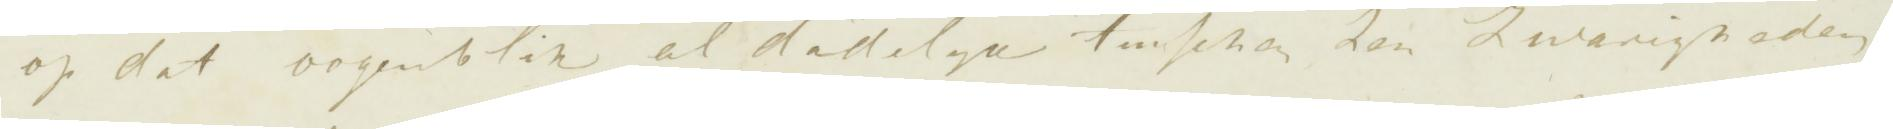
op dat oogenblik al dadelijk tusschen hen Zwarigheden
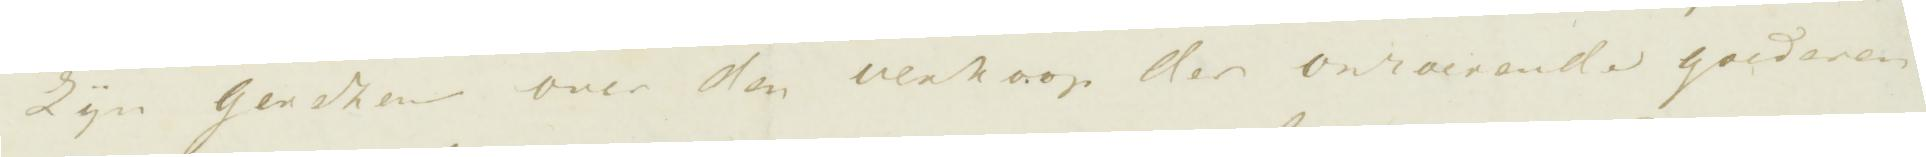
zijn gerezen over den verkoop der onroerende goederen
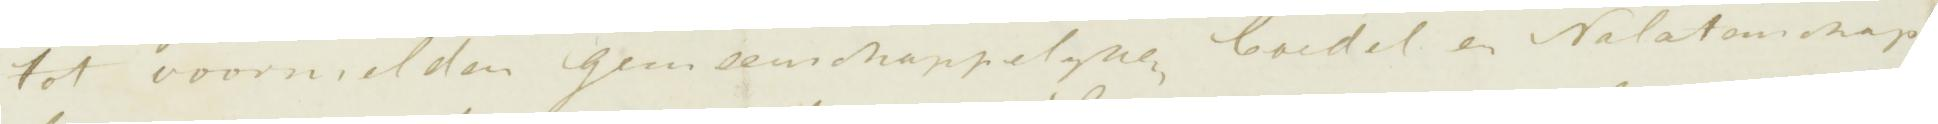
tot voormelden gemeenschappelyken boedel en Nalatenschap
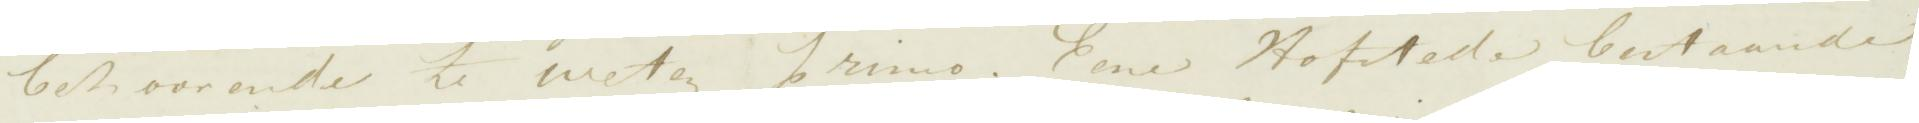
behoorende te weten primo. Eene Hofstede bestaande
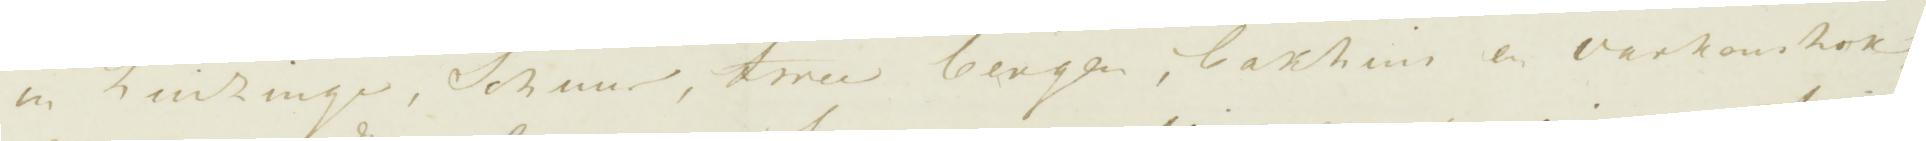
in huizinge, schuur, twee bergen, bakhuis en varkenshok,
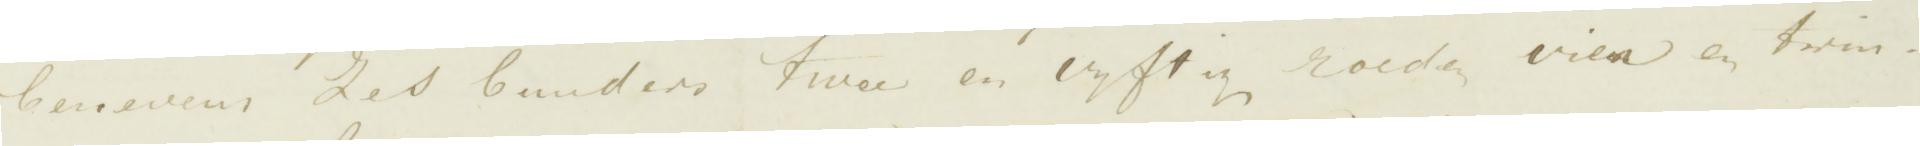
benevens Zes bunders twee en vyftig roeden vier en twin„
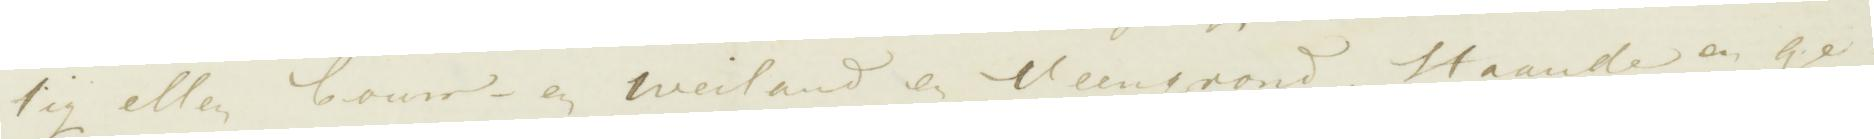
tig ellen bouw- en weiland en Veengrond, staande en ge
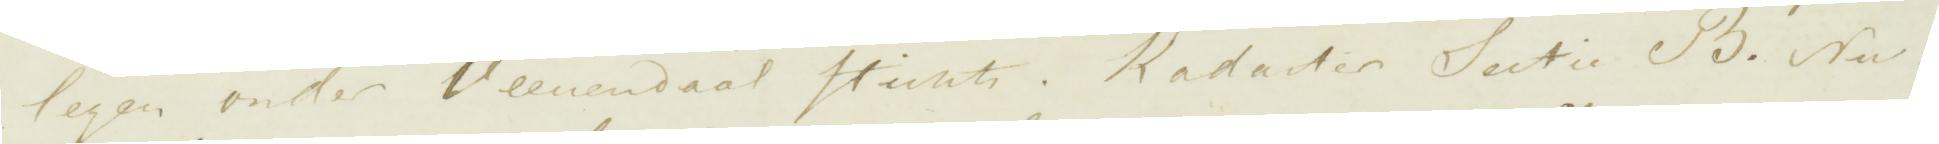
legen onder Veenendaal stichts. Kadaster Sectie B. Nu-
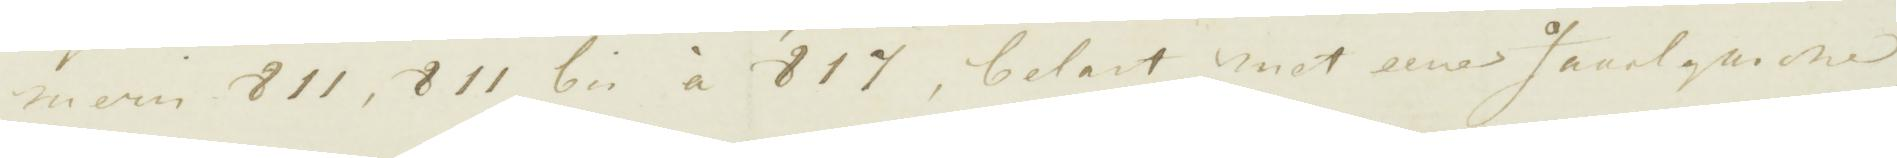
mers 811, 811 bis à 817, belast met eene Jaarlyksche
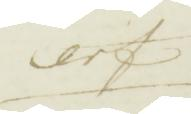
erf
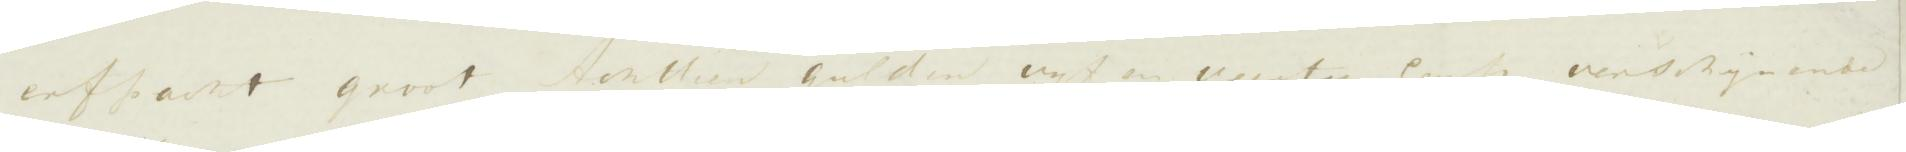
erfpacht groot Achttien gulden vyf en veertig Cents verschijnende
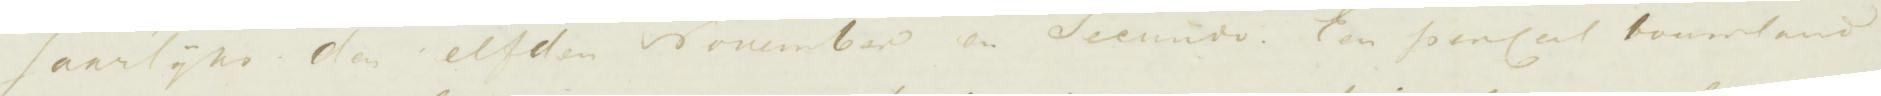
Jaarlijks den elfden November en Secundo. Een perceel bouwland
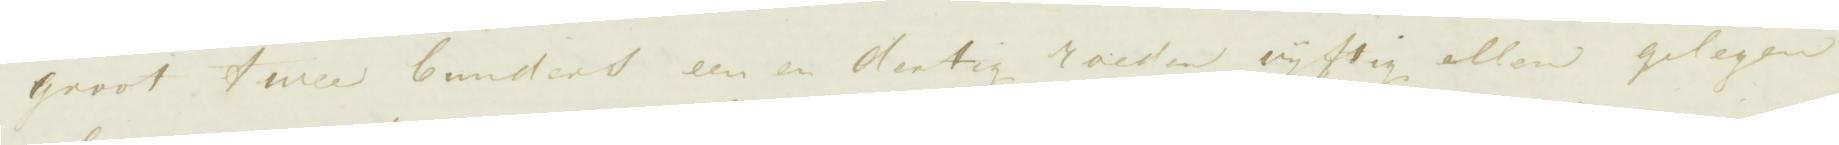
groot twee bunders een en dertig roeden vijftig ellen gelegen
